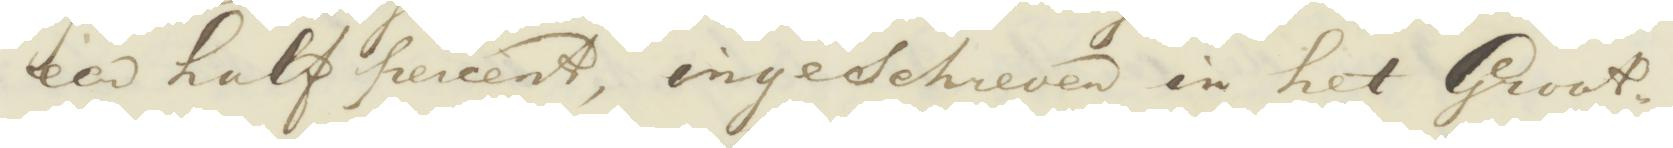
een half percent, ingeschreven in het Groot„
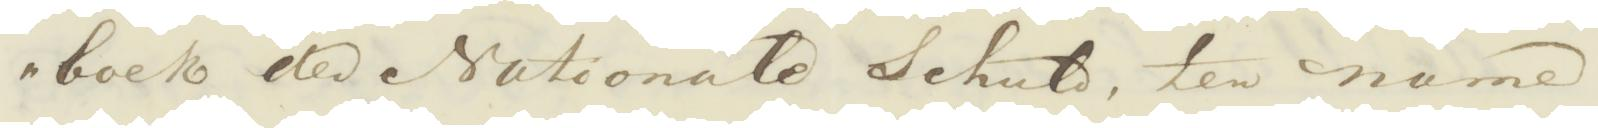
„boek der Nationale schuld, ten name
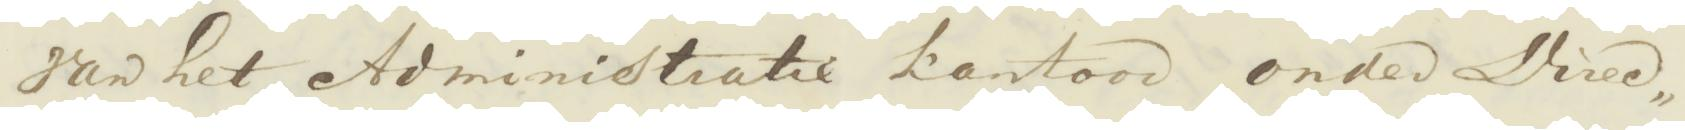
van het Administratie kantoor onder Direc„
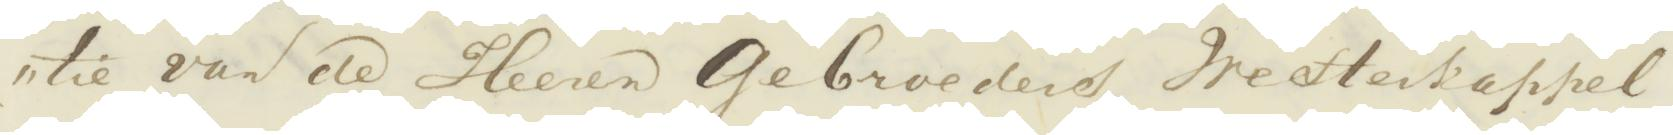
„tie van de Heeren Gebroeders Westerkappel
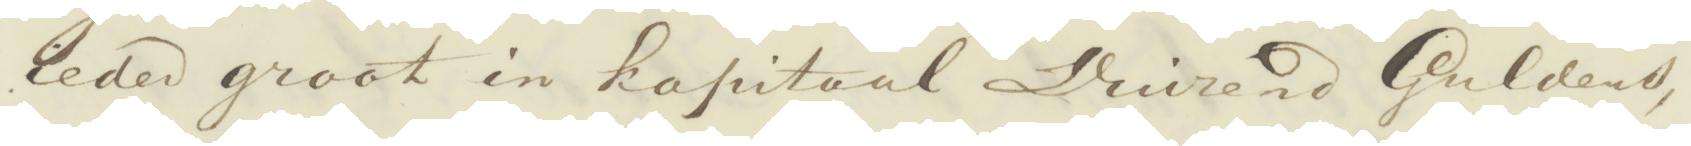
ieder groot in kapitaal Duizend Guldens,
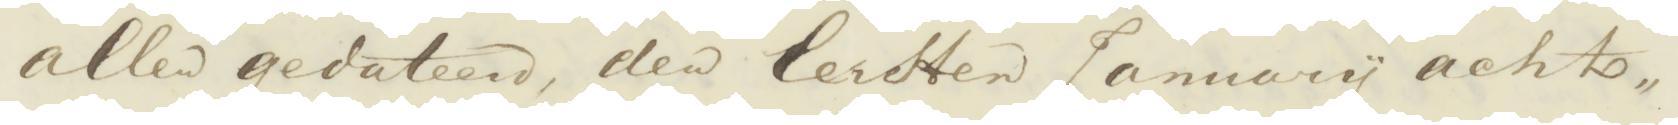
allen gedateerd, den Eersten Januarij acht„
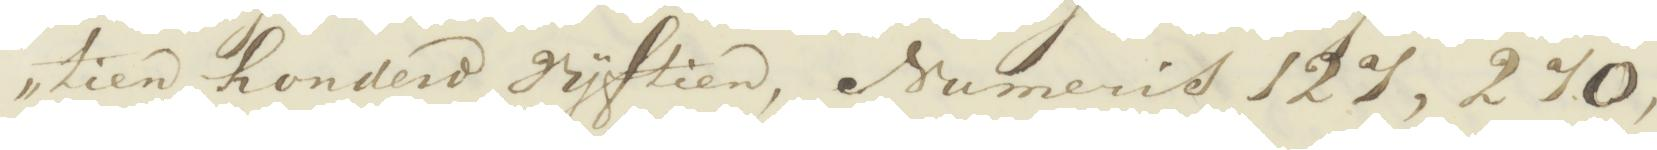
„tien honderd vijftien, Numeris 127, 270
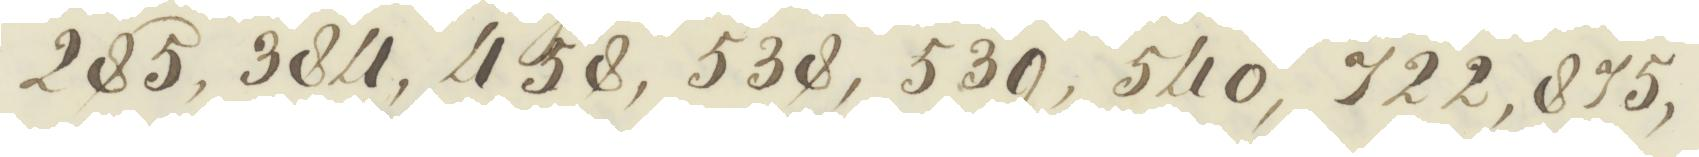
285, 384, 458, 538, 539, 540, 722, 875,
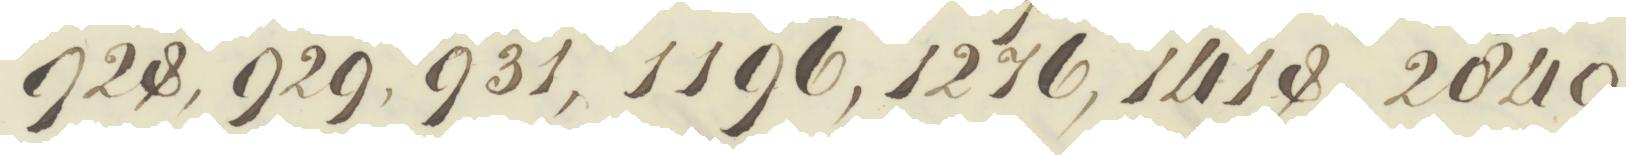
928, 929, 931, 1196, 1276, 1418, 2849
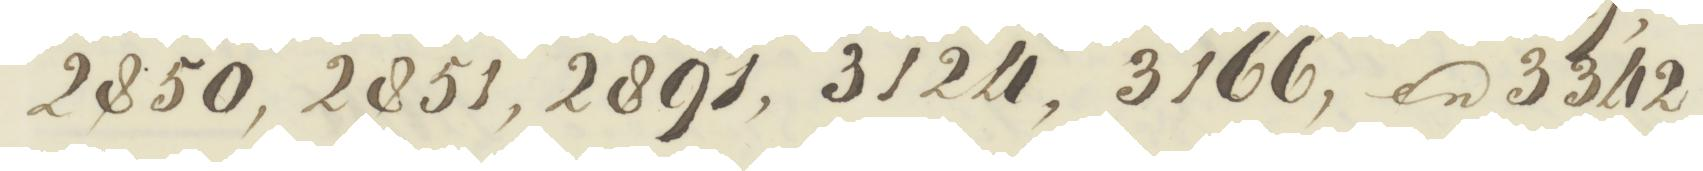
2850, 2851, 2891, 3124, 3166, en 3342
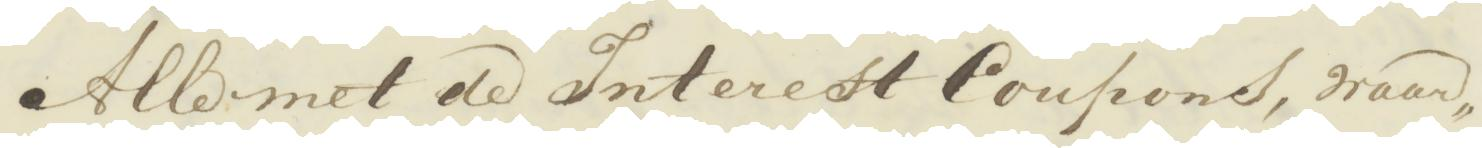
Alle met de Interest Coupons, waar„
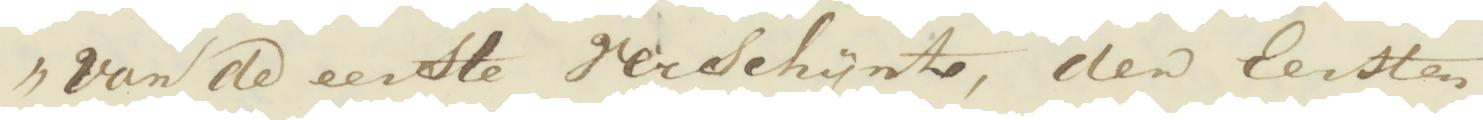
„van de eerste verschijnt, den Eersten
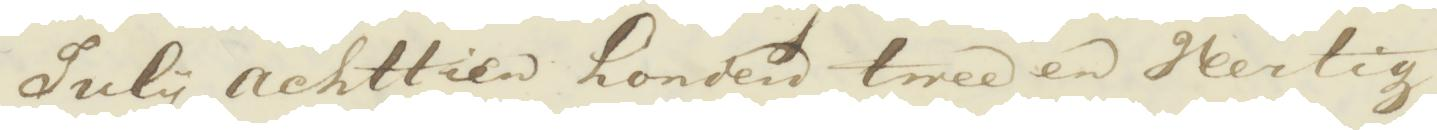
Iulij achttien honderd twee en veertig
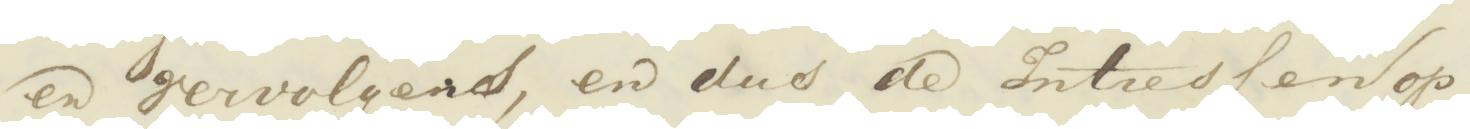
en vervolgens, en dus de Intressen op
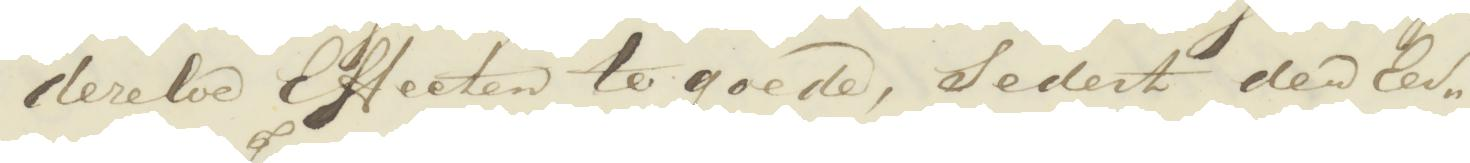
dezelve Effecten te goede, sedert den Eer
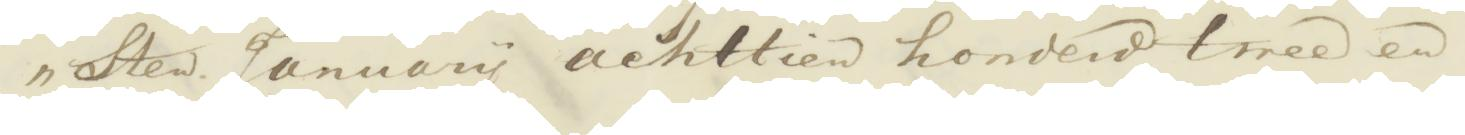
sten Januarij achttien honderd twee en
